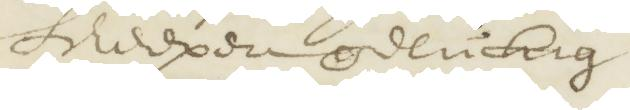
scheepen geluckig
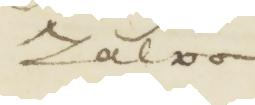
zalvo
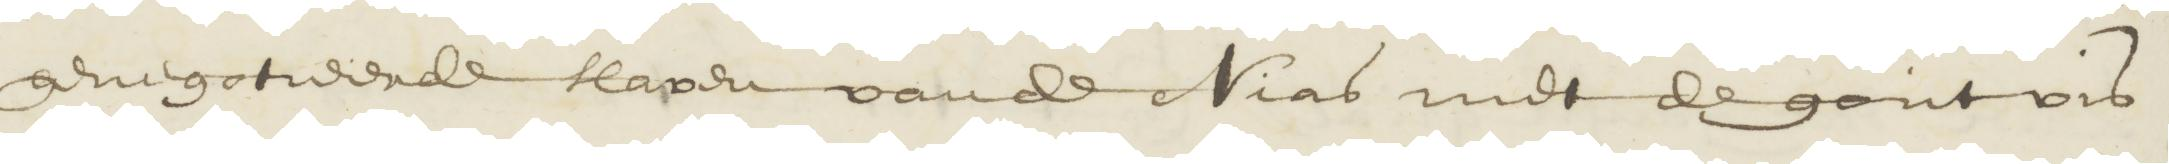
genegotieerde slaven van de Nias met de gout vis
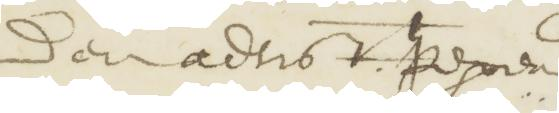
Den adsis.t peper
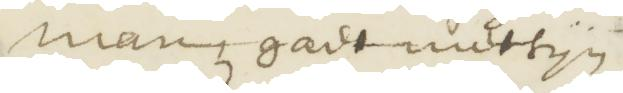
man gaet metsijn
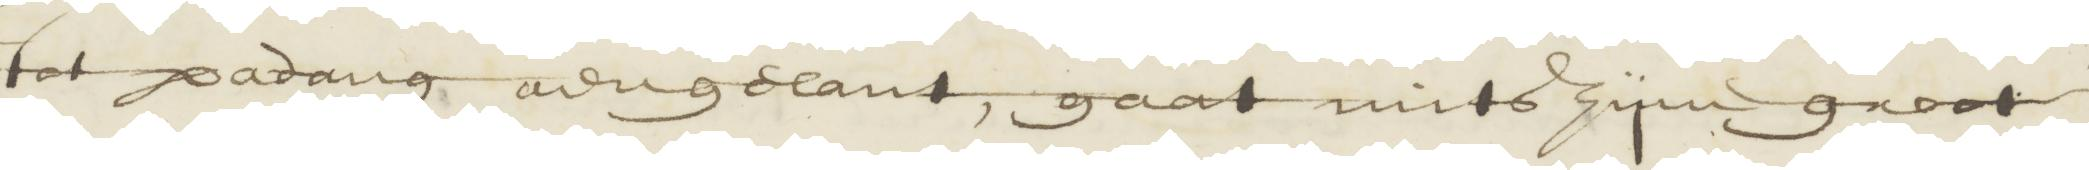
tot padang aengelant, gaat mits Zijne groote
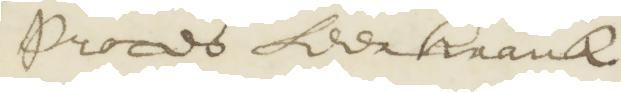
proces seerkrank
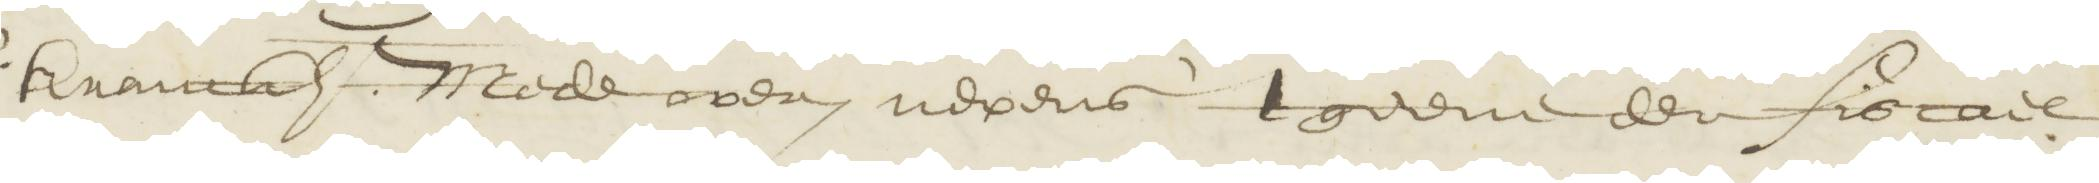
kranckh.t Mede over, nevens ’t geene den fiscael
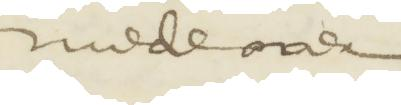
mede over
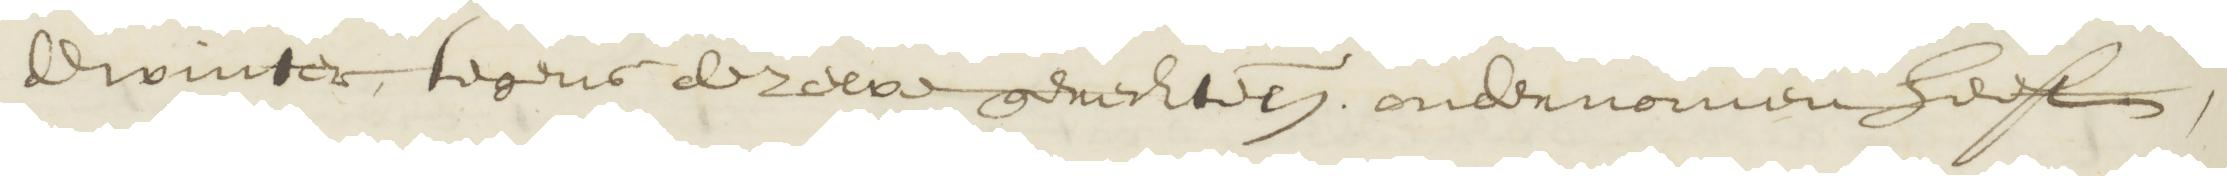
de winter, tegens dezelve gerechtelijk ondernomen heeft,
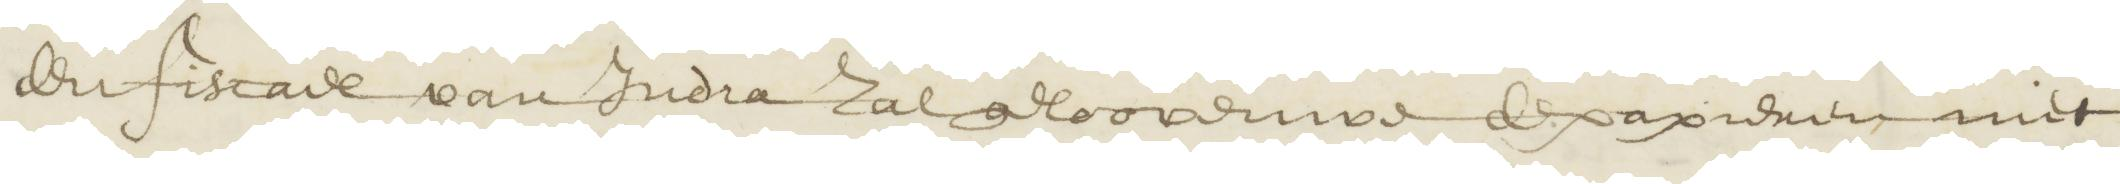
den fiscael van Indra zal gelooven we de papieren niet
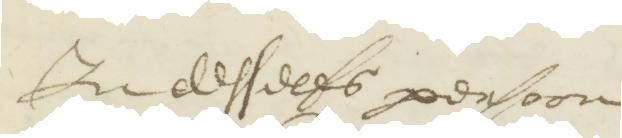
In desselfs persoon
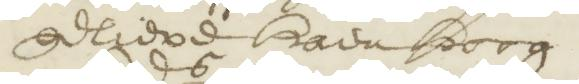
gelieve haer hoog
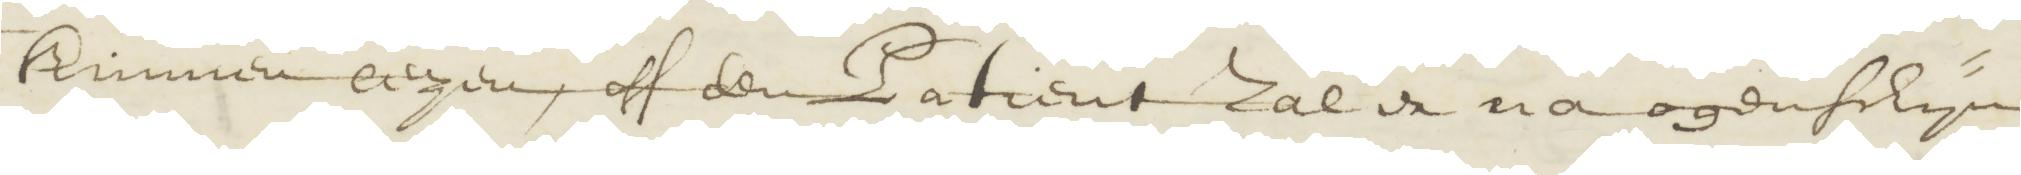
kunnen lezen, off den Patient Zal er na ogenschijn=
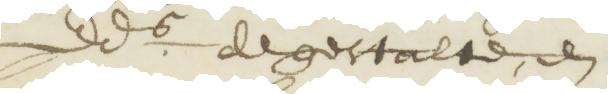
Ed de gestalte, en
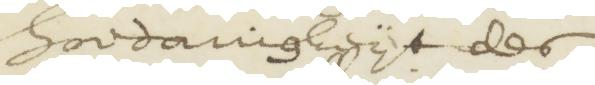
hoedanigheijt des
